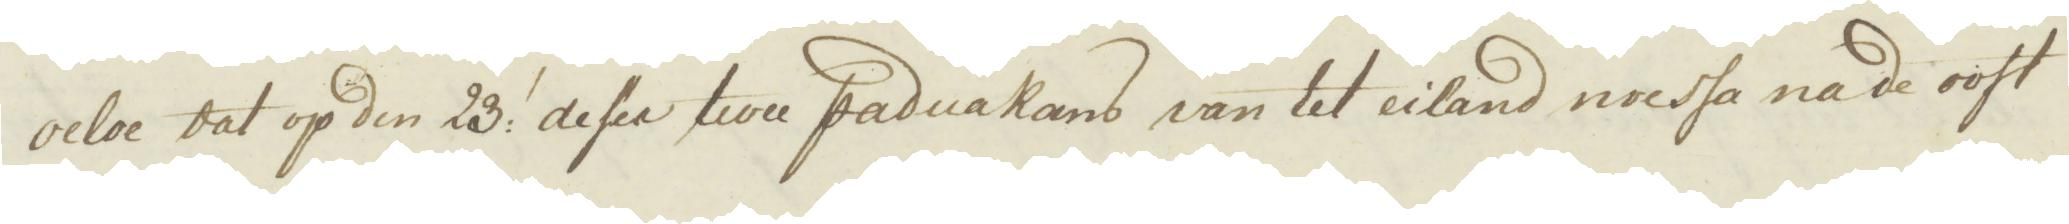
oeloe dat op den 23:' deser twee paduakans van het eiland noessa nade oost
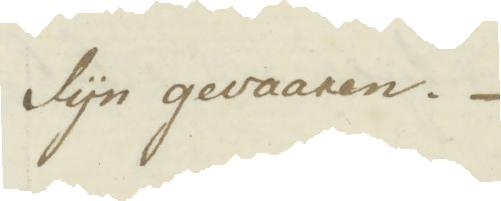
sijn gevaaren. -
